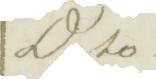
Dito . . . . . . . . .
